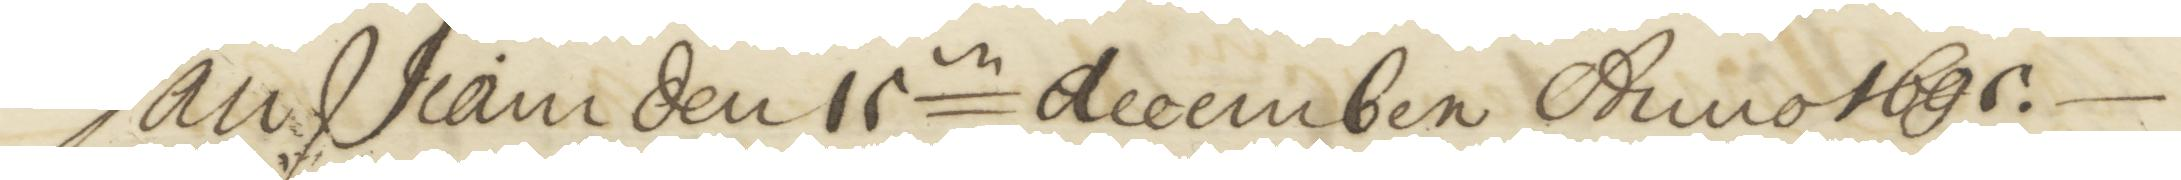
Van Siam den 15=n december Anno 1695. —
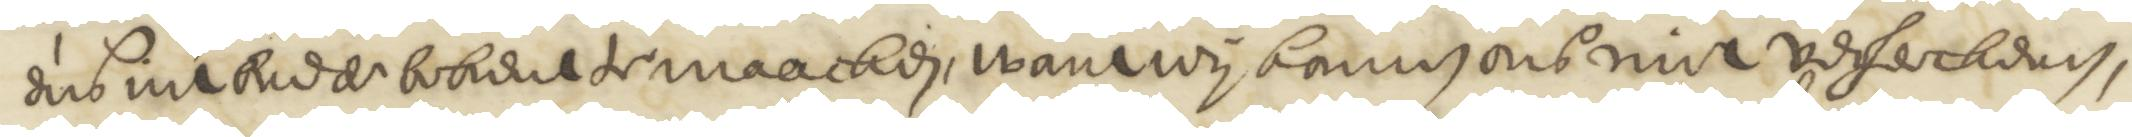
dus in't Reede bekent te maacken, want wij konnen ons niet verseeckeren,
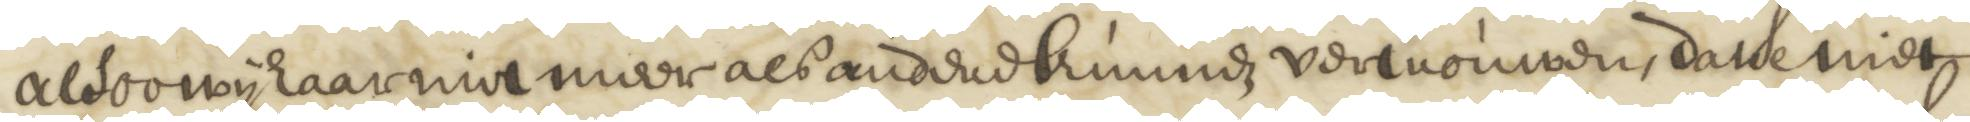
alsoo wij haar niet meer als andere kunnen vertrouwen, datse niet
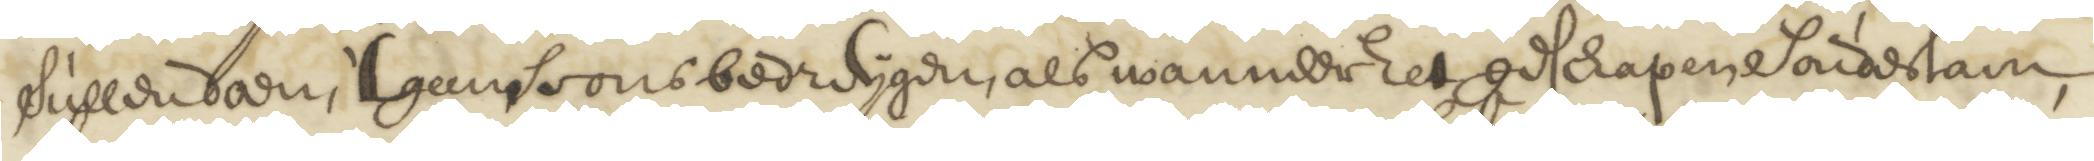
sullen doen, ’t geense ons bedreijgen, als wanneer het geschapen soude staen,
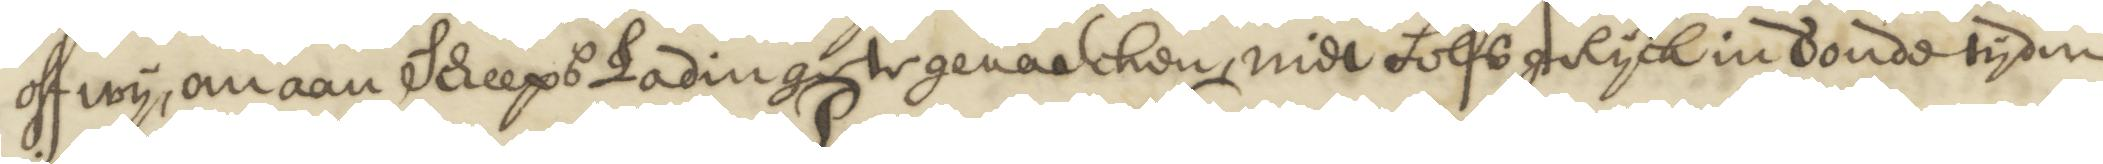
off wij, om aan scheeps Ladinge te geraecken, niet selfs gelijck in d'oude tijden
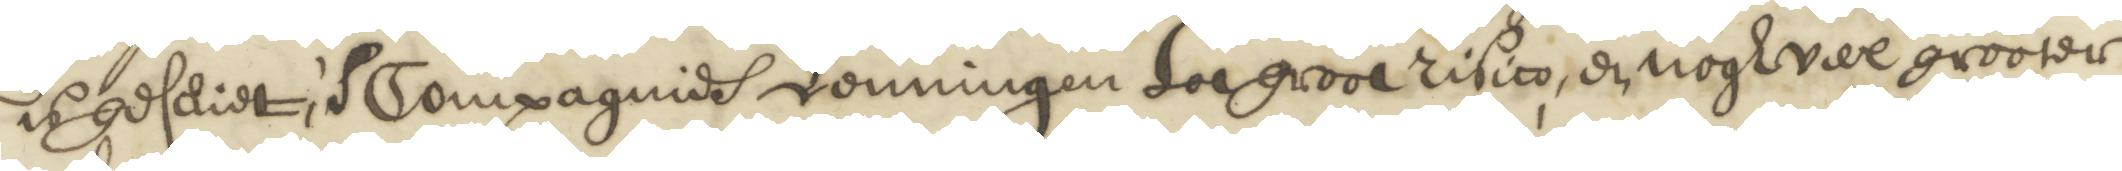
is geschiet, ’s Compagnies Penningen tot groot risico, en nogh veel grooter
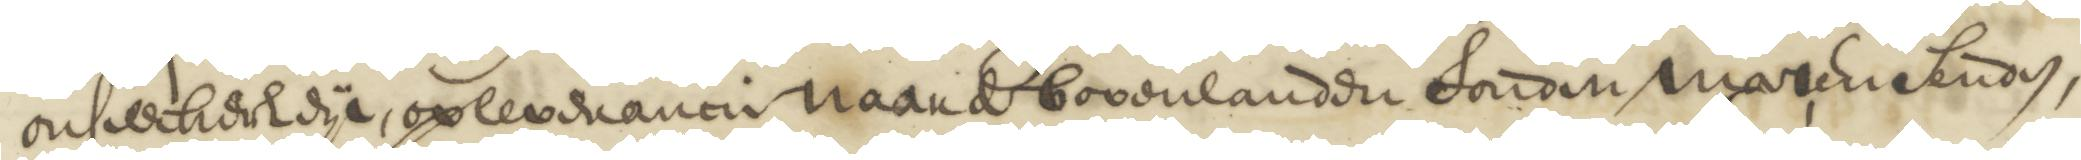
onseeckerheijt, op leverancie naar de bovenlanden souden moeten senden,
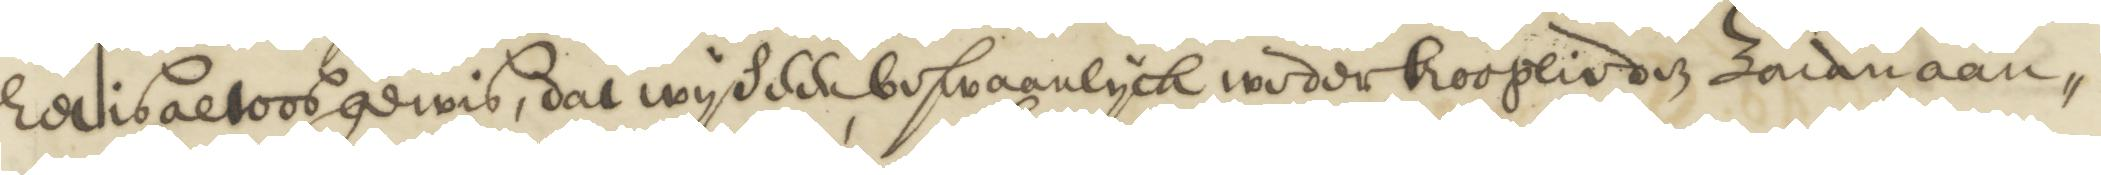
het is altoos gewis, dat wij seer beswaarlijck weder kooplieden zouden aan„
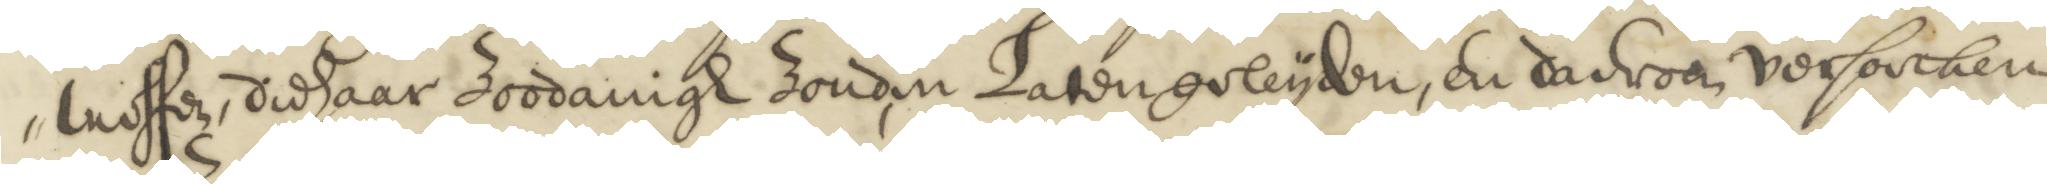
„treffen, diehaar zoodanigh zouden laten geleijden, en daerom versoecken
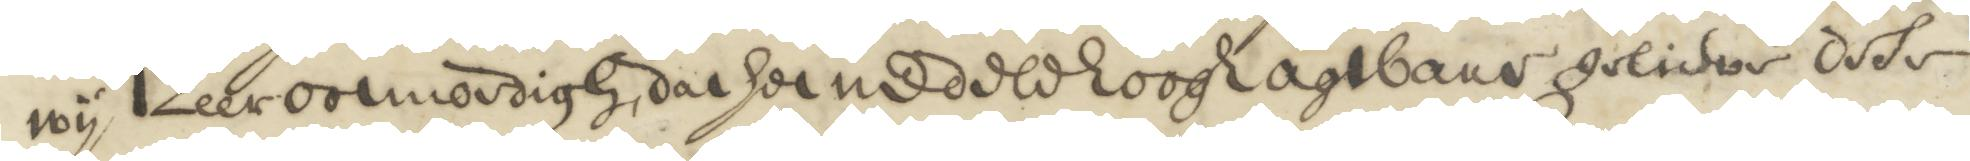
wij zeer ootmoedigh, dat het uEdele hoogh agtbare gelieve dese
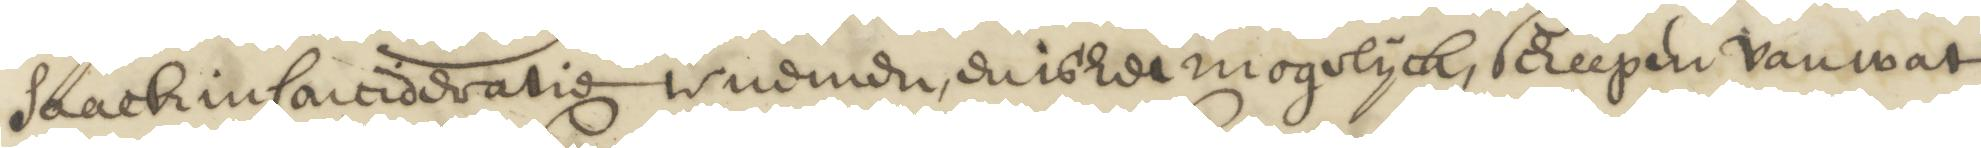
saack in Concideratie te nemen, en is het mogelijck, scheepen van wat
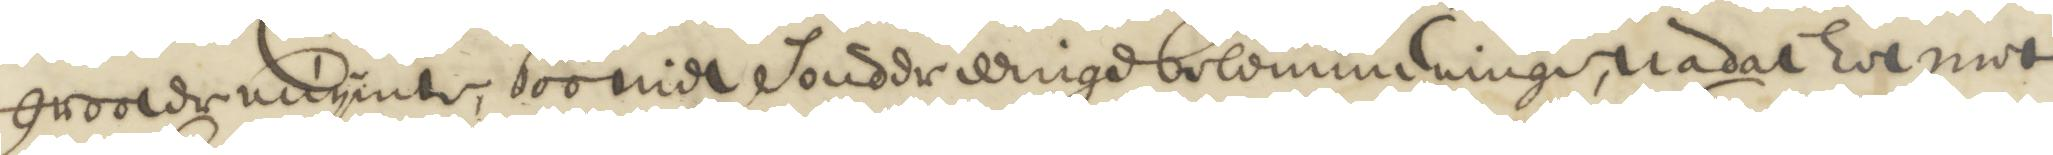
grooter ruijm te, soo niet sonder eenige belemmeringe, na dat het met
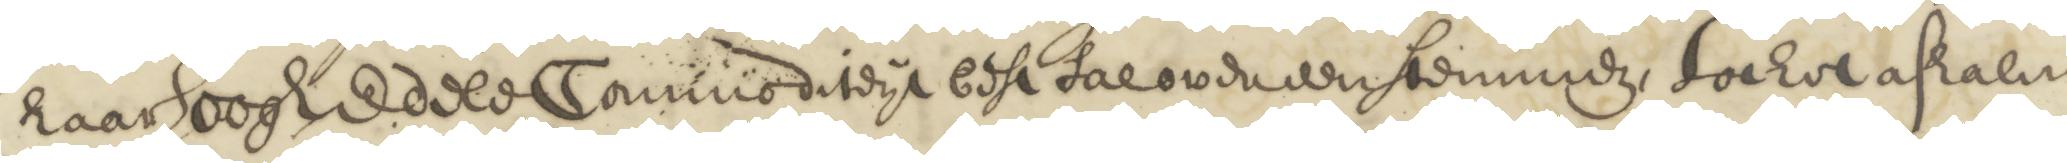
haar hoogh Edele Commoditeijt best sal over een stemmen, tot het ashalm
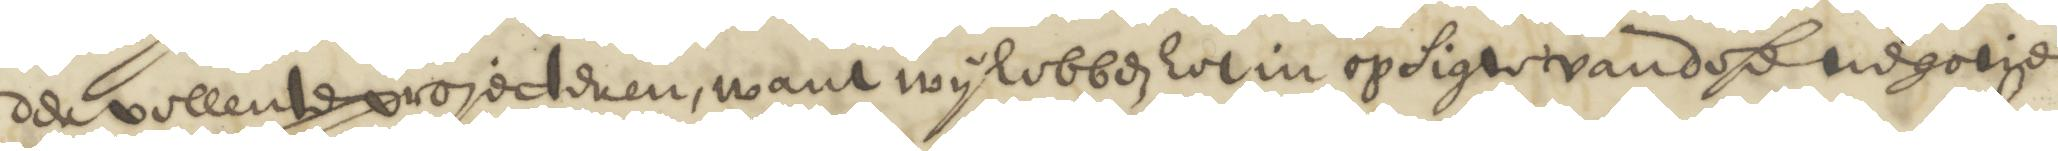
der vellen te projecteren, want wij hebben het in op sigte van dese negotie
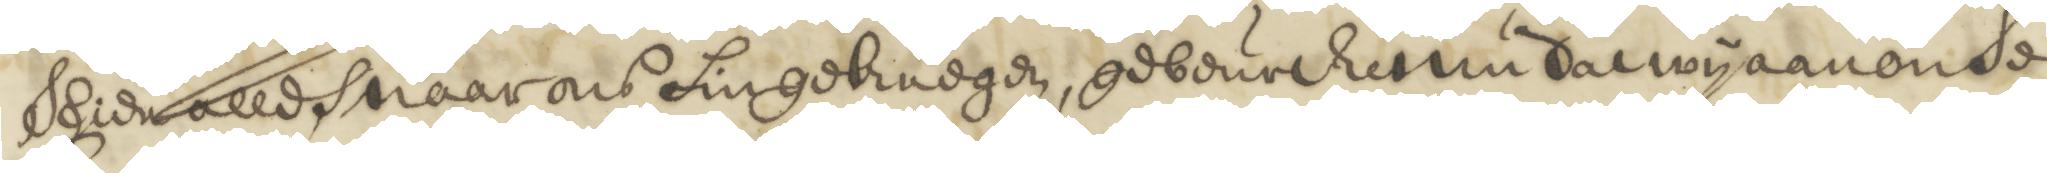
schier alles naar ons sin gekregen, gebeurt het nu dat wij aan onse
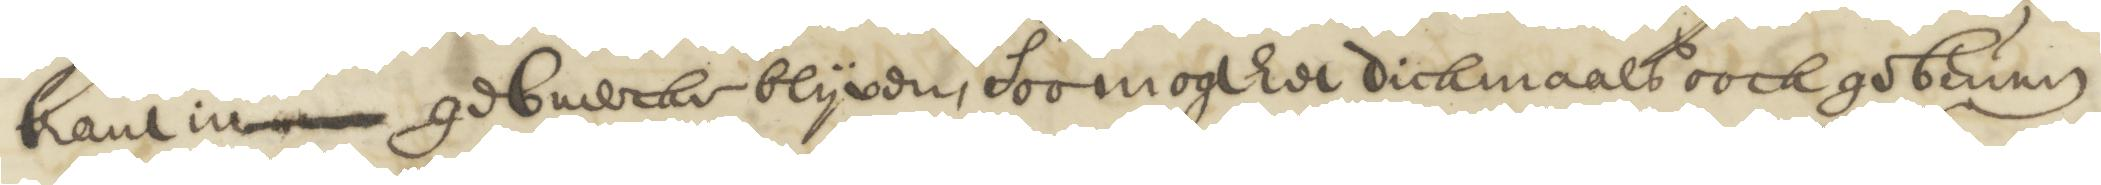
kant in gebreecke blijven, soo mogt het dickmaals oock gebeuren
